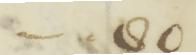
-.80
